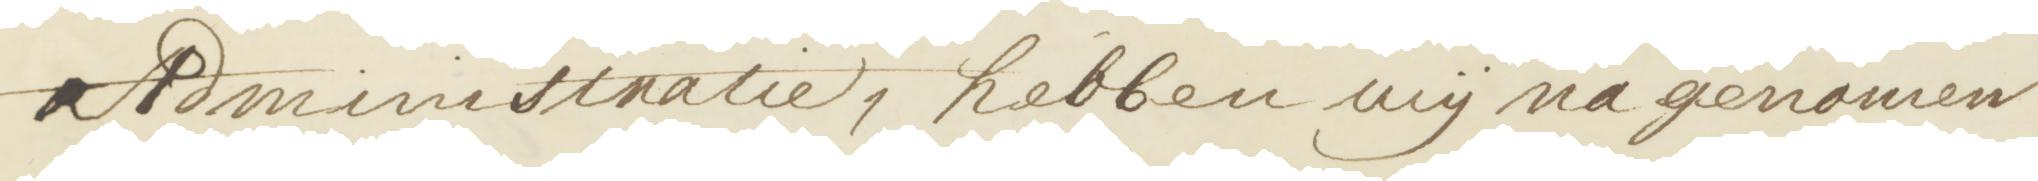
Administratie, hebben wij na genomen
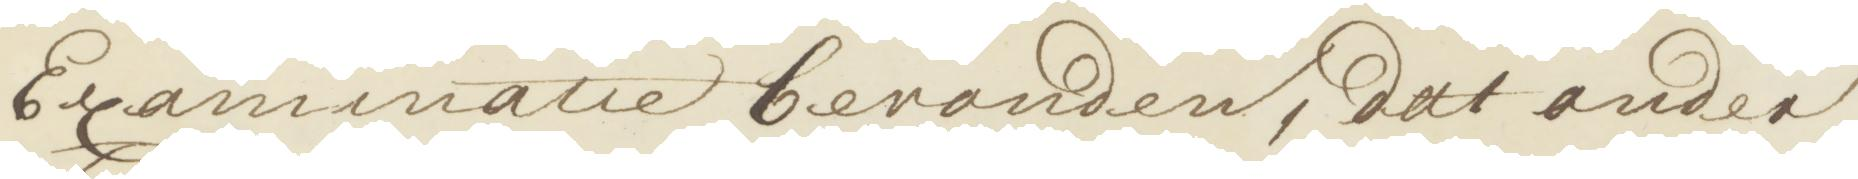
Examinatie bevonden, dat onder
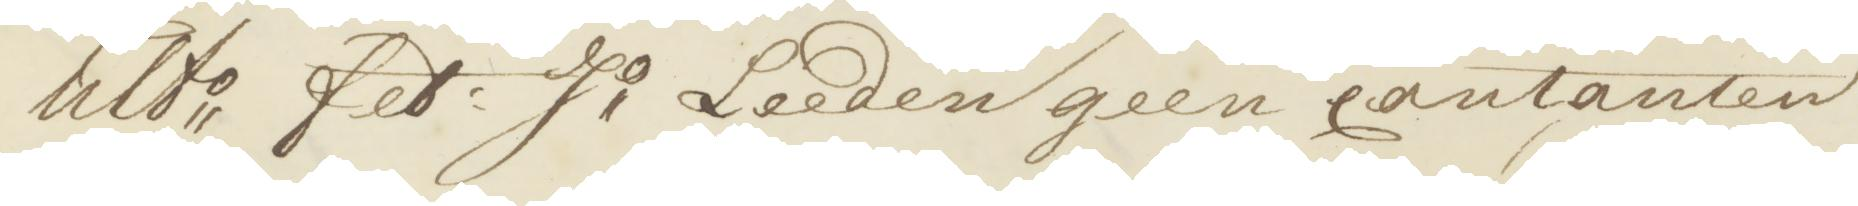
ult„o feb: J„o Leeden geen Contanten
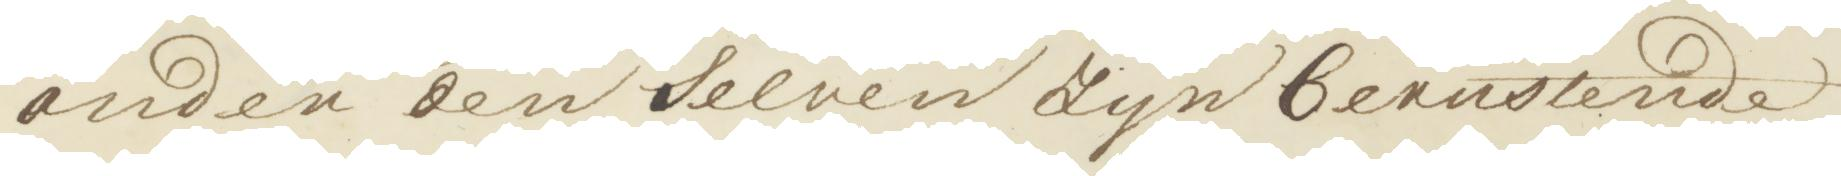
onder den selven zijn berustende
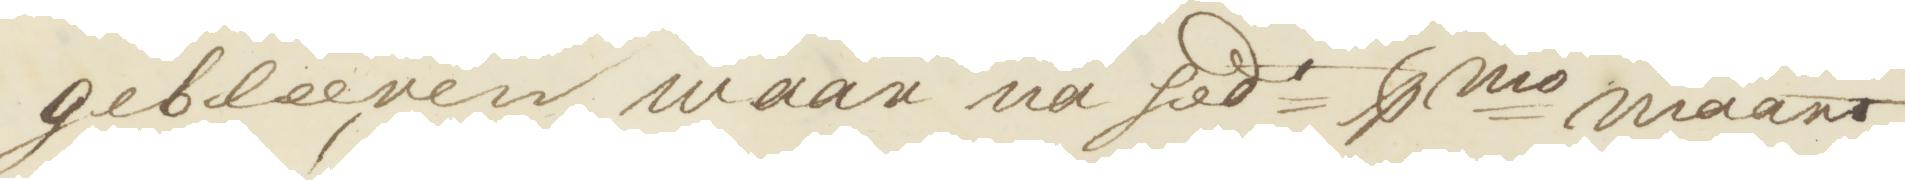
gebleeven waar na sed=t p=mo maart
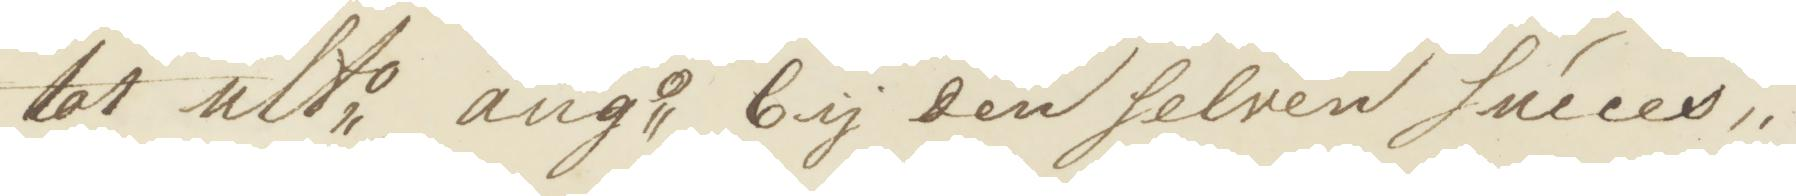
tot ult„o aug„o bij den selven succes„
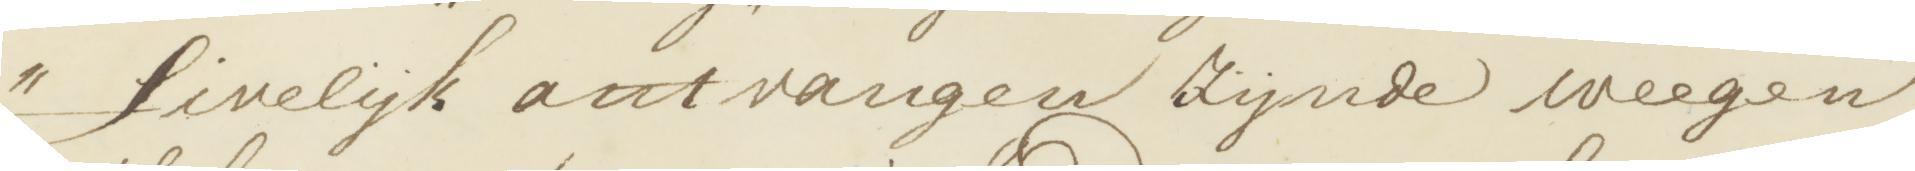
„ sivelijk ontvangen zijnde weegen
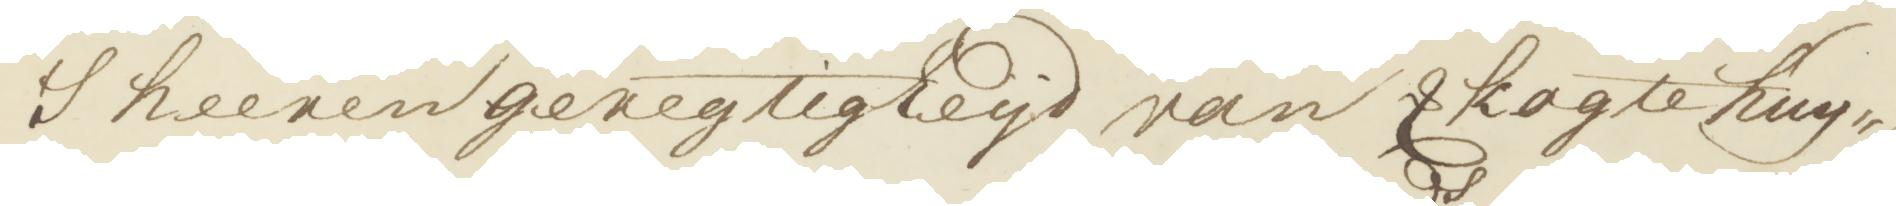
's heeren geregtigheijd van verkogte huy„
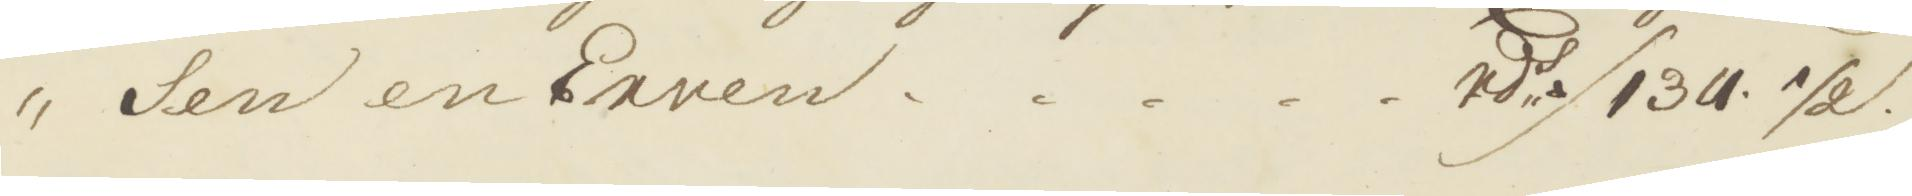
„sen en Erven - - - - - rd„s ƒ134. ½.
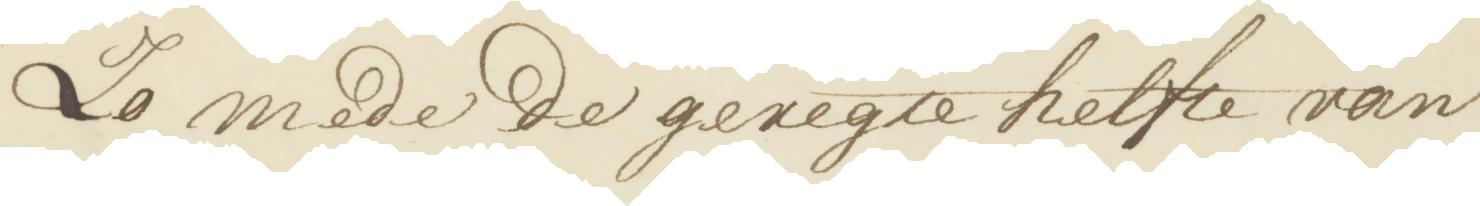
Zo mede de geregte helfte van
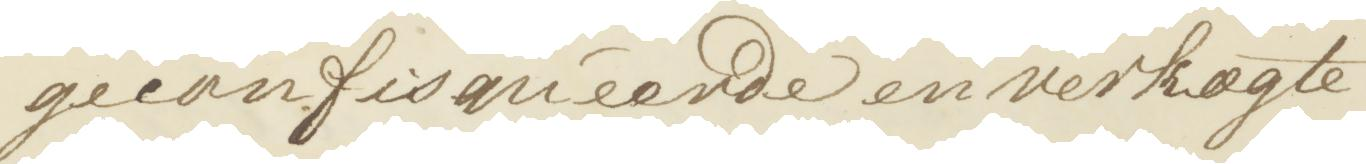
geconfisqueerde en verkogte
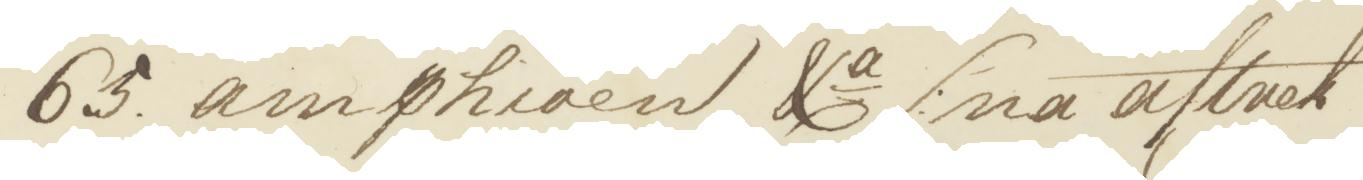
65. amphioen &=a /: na aftrek
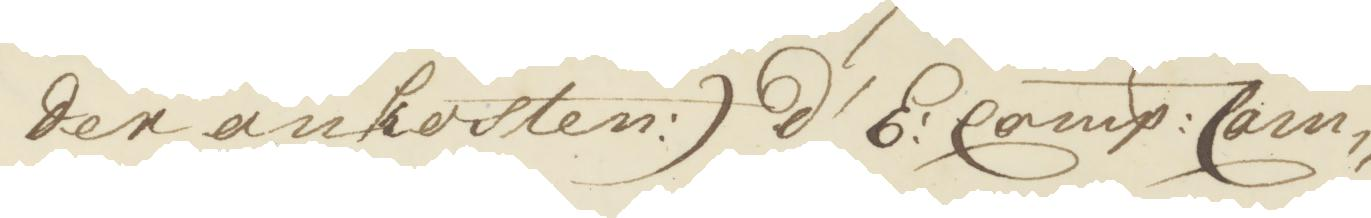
der onkosten:) d’ E: Comp: Com„
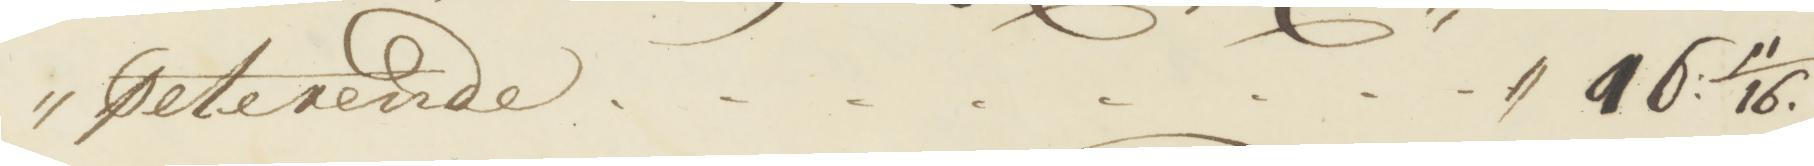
„peterende - - - - - - - - „ 46: 11/16.
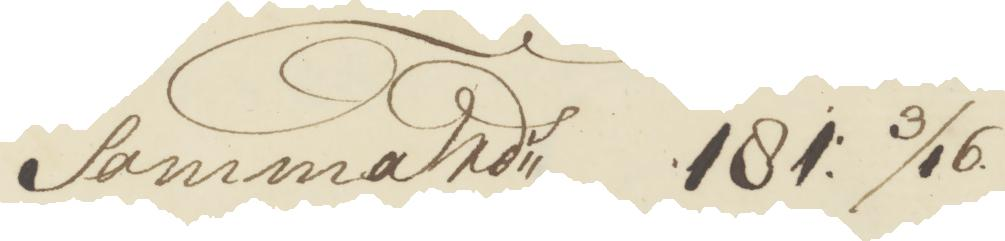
Somma rd„s 181: 3/16.
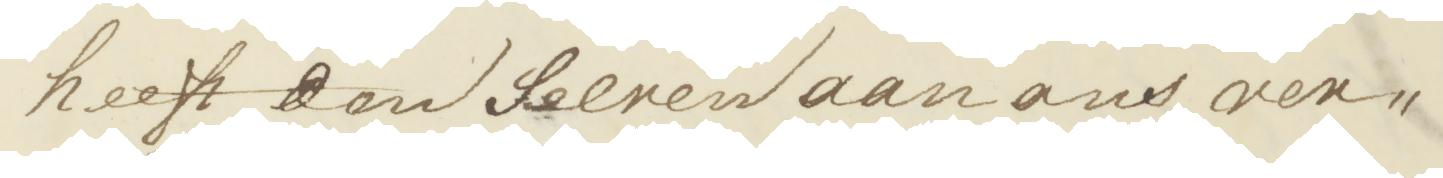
heeft den selven aan ons ver„
